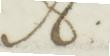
A:
